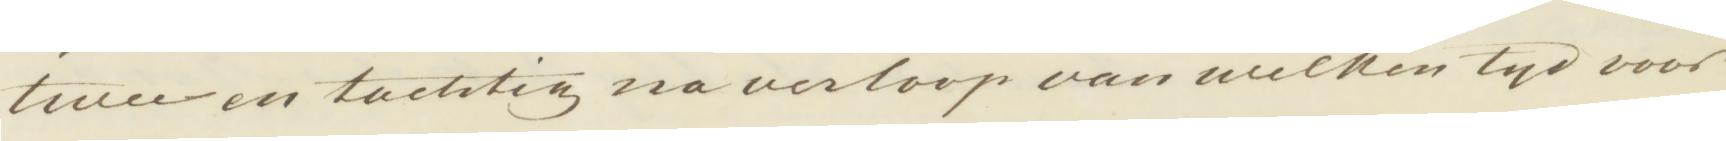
twee en tachtig na verloop van welken tyd voor
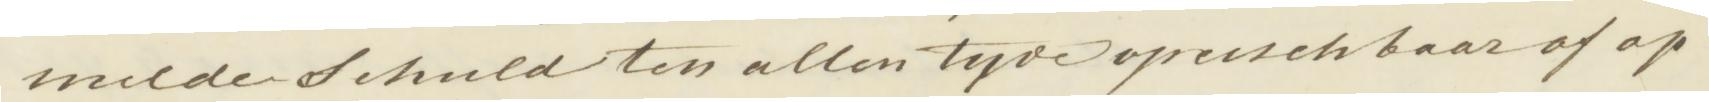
melde schuld ten allen tyde opeischbaar of op
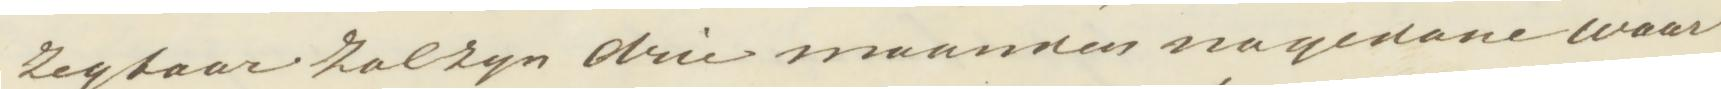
zegbaar zal zyn drie maanden nagedane waar
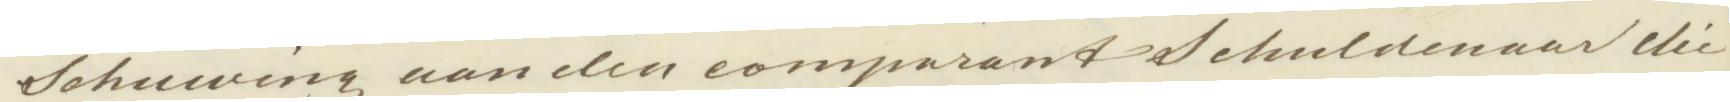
schuwing aan den comparant schuldenaar die
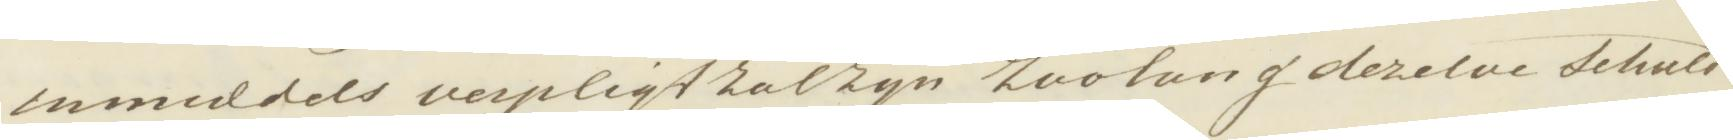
inmiddels verpligt zal zyn zoolang dezelve schuld
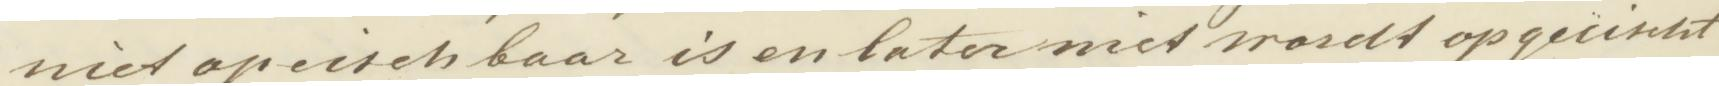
niet opeischbaar is en later niet wordt opgeëischt
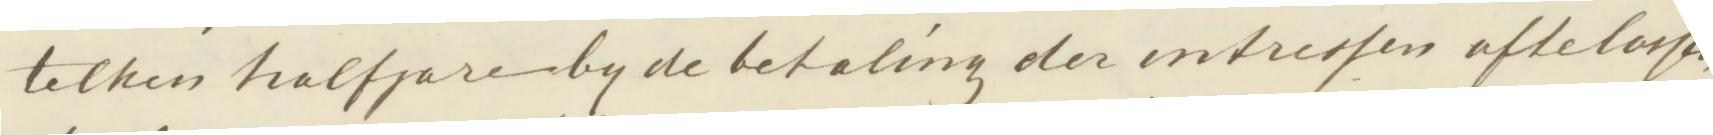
telken halfjare by de betaling der intressen aftelossen
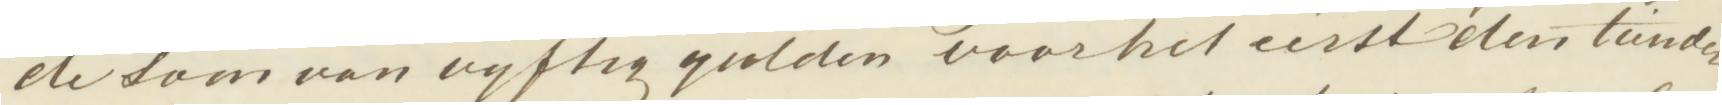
de som van vyftig gulden voor het eerst den tienden
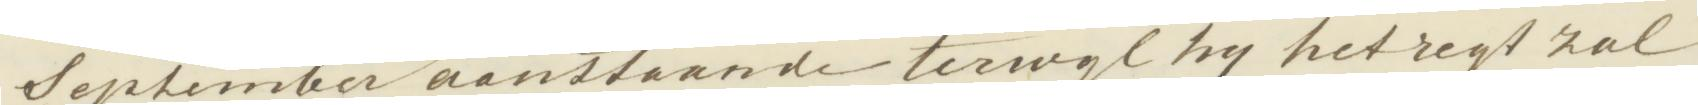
September aanstaande terwyl hy het regt zal
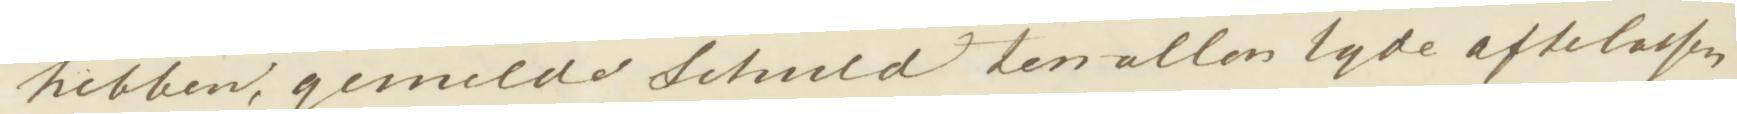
hebben, gemelde schuld ten allen tyde aftelossen
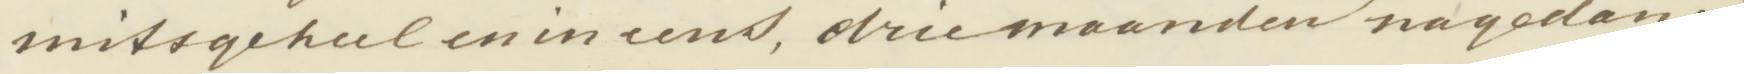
mitsgeheel en in eens, drie maanden nagedane
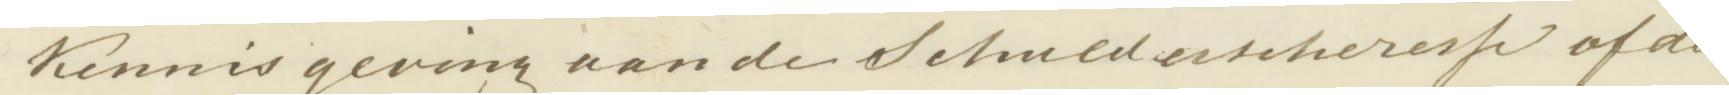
Kennis geving aan de Schuldeischeresse of den
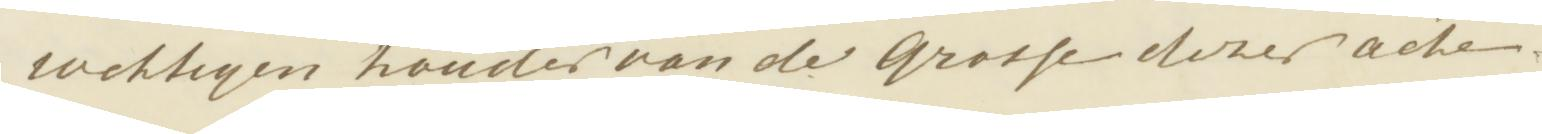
wettigen houder van de Grosse dezer acte
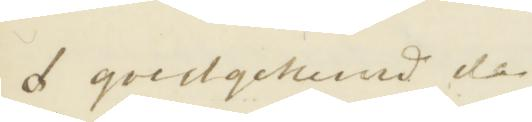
| goedgekeurd de
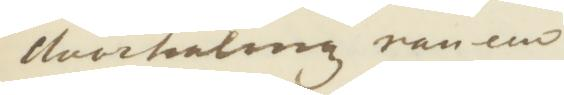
doorhaling van een
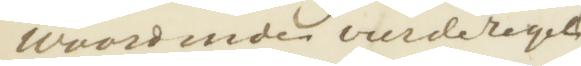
woord inde vierde regel
